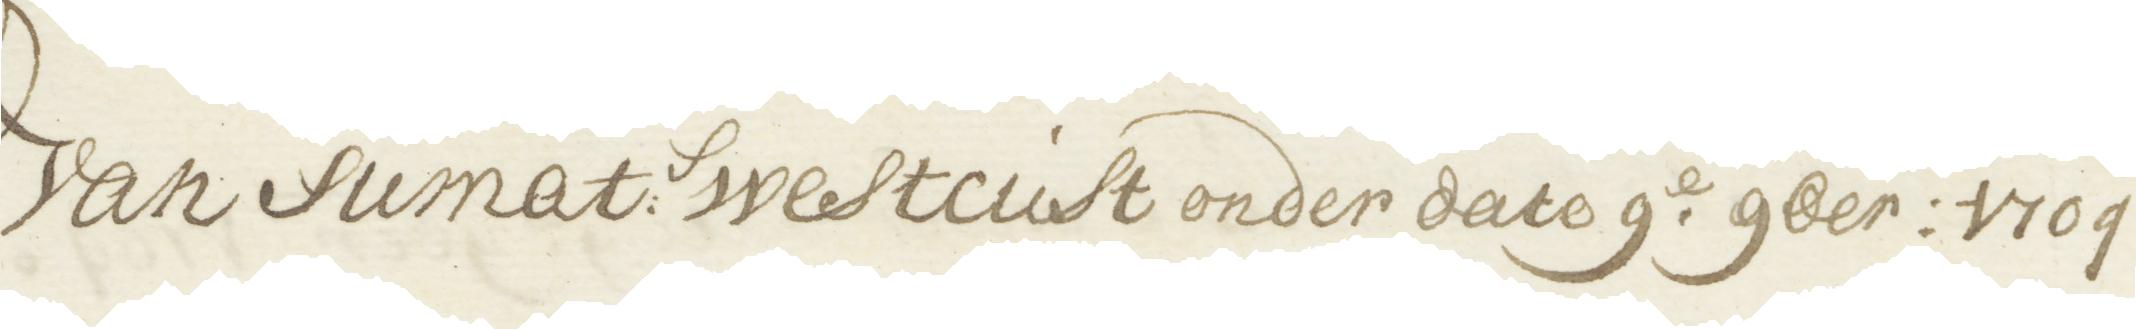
Van Sumat:s westcust onder dato 9:e 9ber: 1709
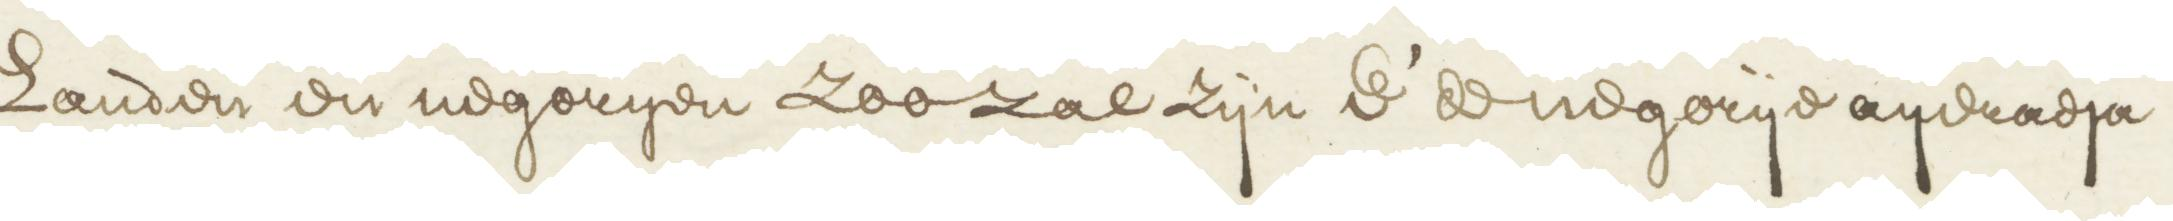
Landen en negoryen zoo zal zijn E:' de negorije aijeradja
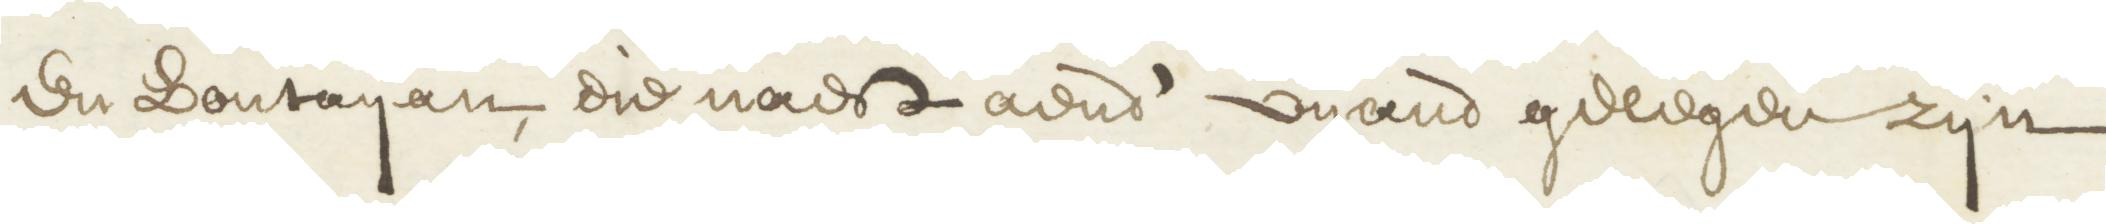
en Bontaijan, die naest aend' vijand gelegen zijn
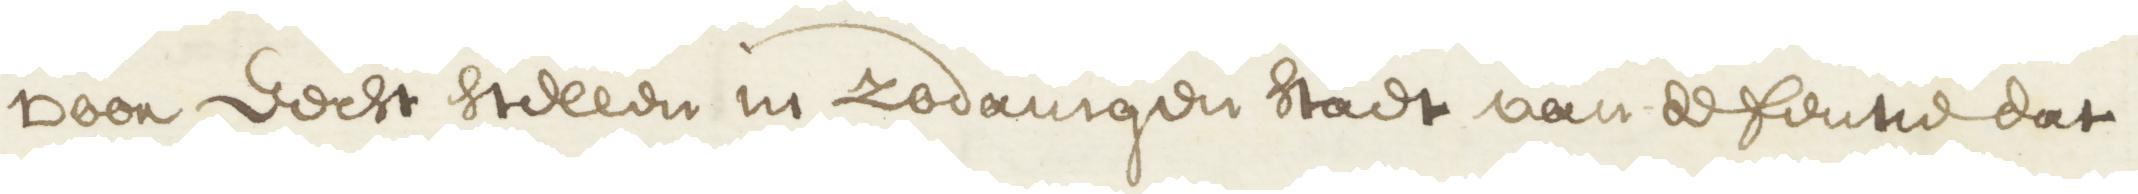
voor Eerst stellen in zodanigen staet van defentie dat
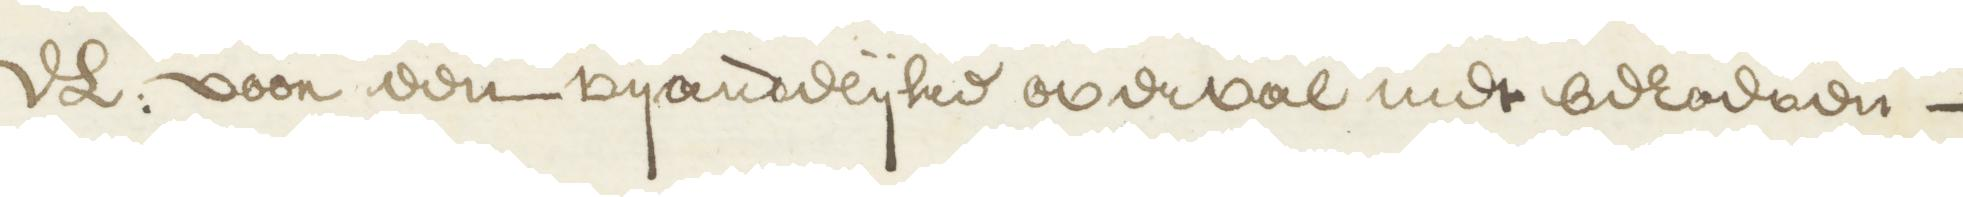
VL. voor een vijandelijke overval niet behoeven
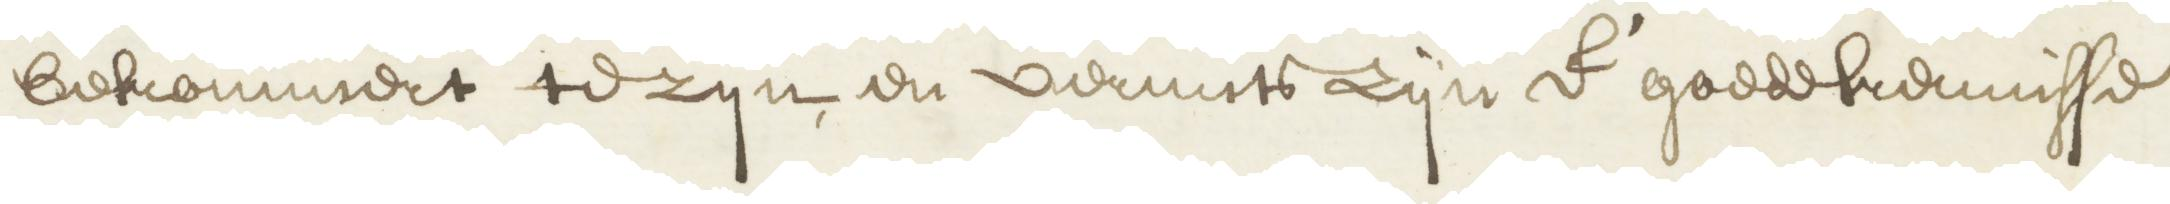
bekommert te zijn en vermits zijn E:' goede kennisse
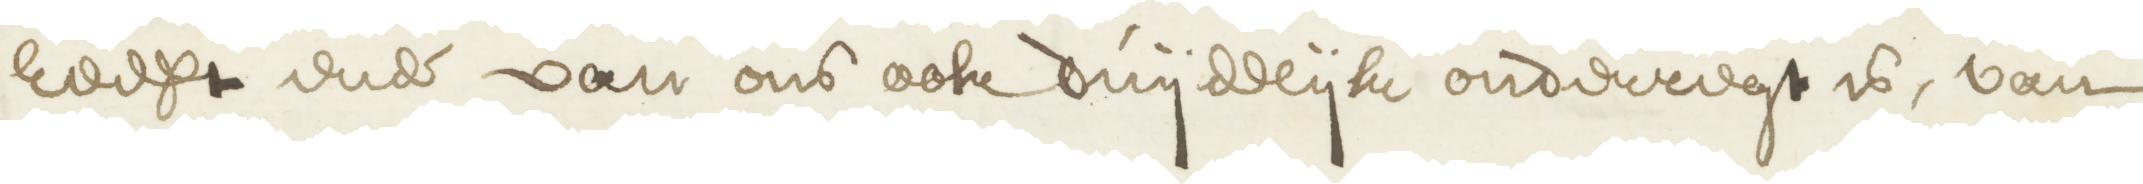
heeft ende van ons ook duijdelijk onderregt is, van
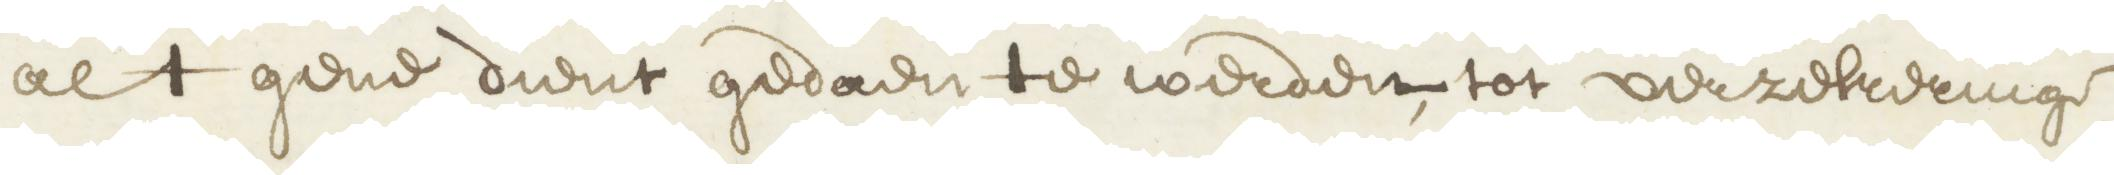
al't gene dient gedaen te werden tot verzekeringe
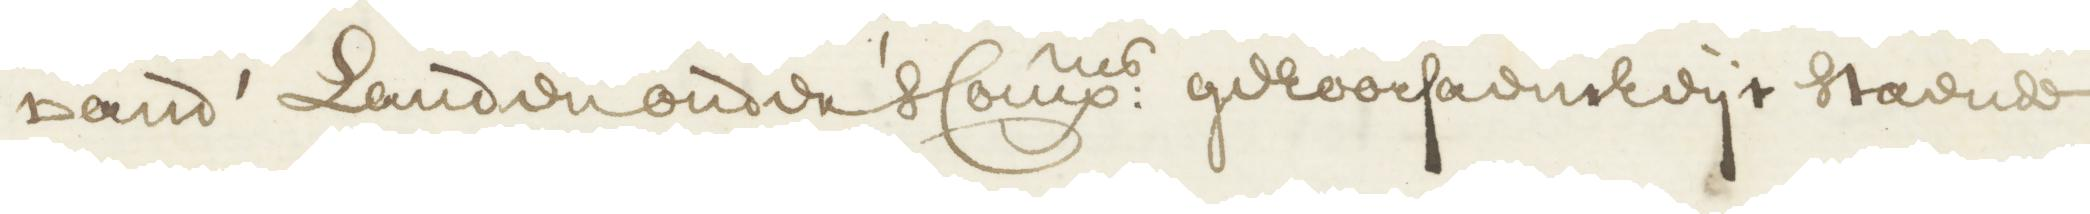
vand' Landen onder ’sComp:s gehoorsaemheijt staende
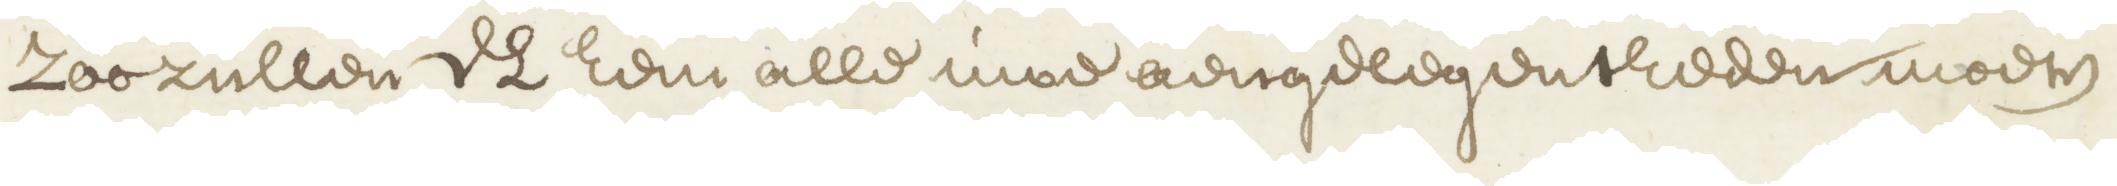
Zoo zullen VL hem alle uwe aengelegentheden moeten
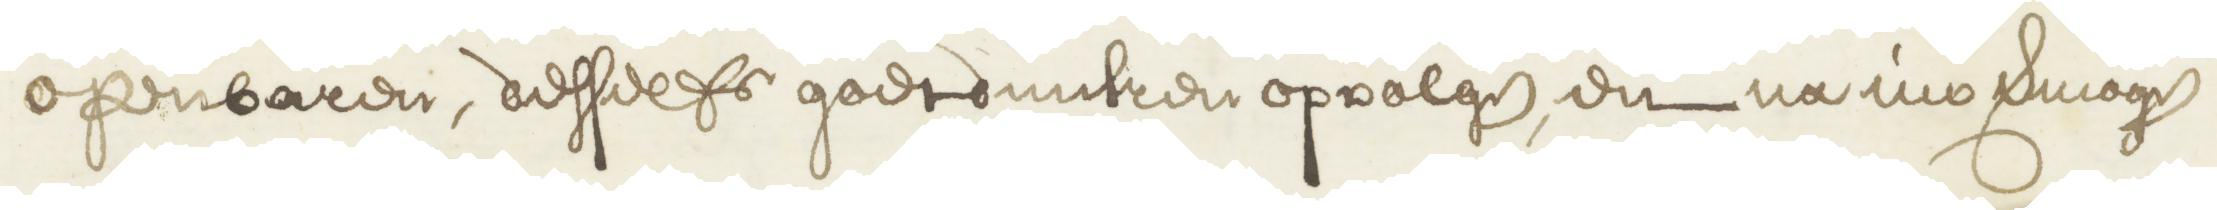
openbaren, desselfs goetdunken opvolgen, en na uw vermogen
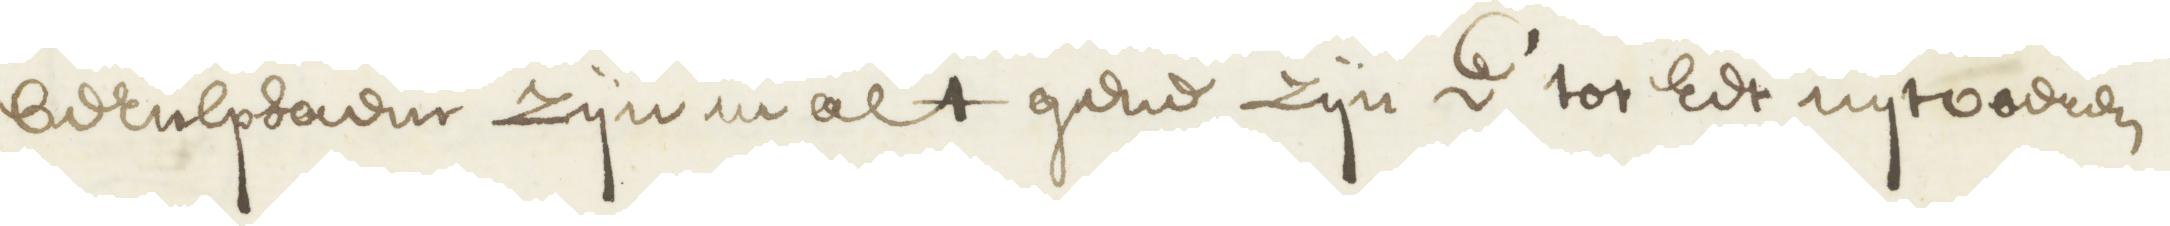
behulpsaem Zijn in alt gene zijn E:' tot het uijtvoeren
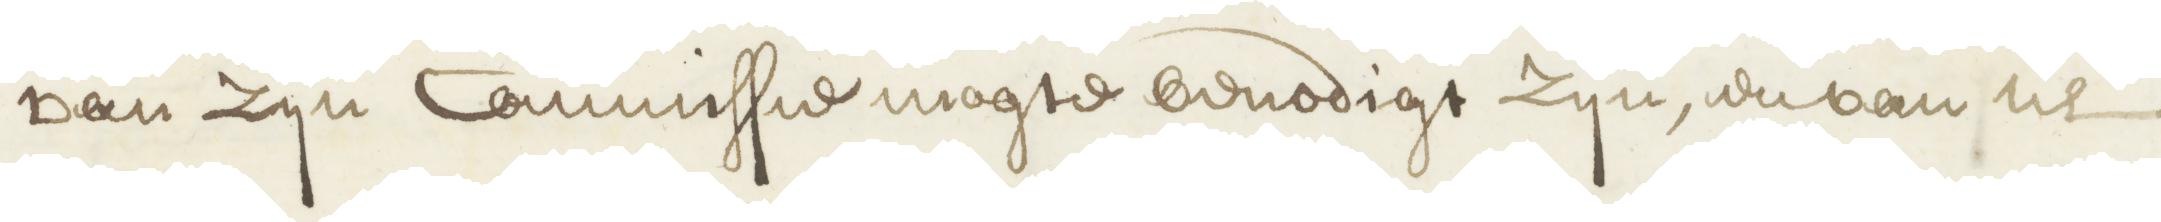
van zijn Commissie mogte benodigt Zijn, en van ul
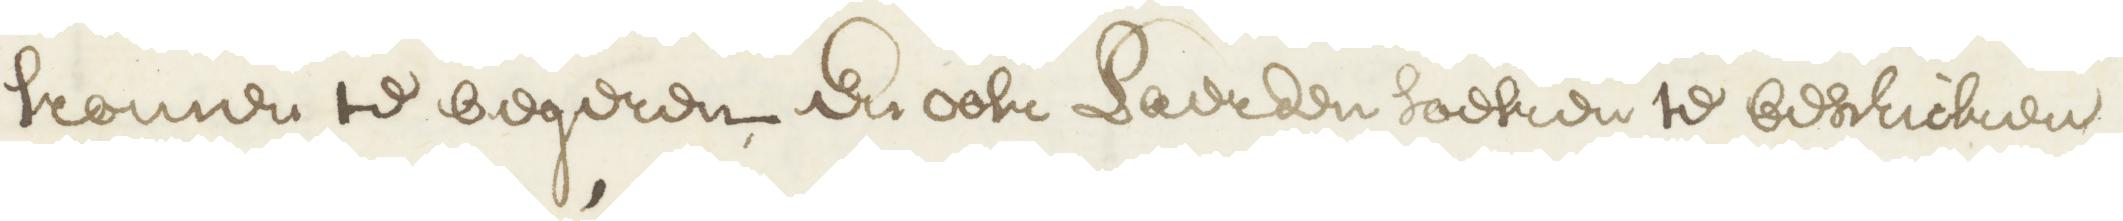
komen te begeren En ook Paerden soeken te beschicken
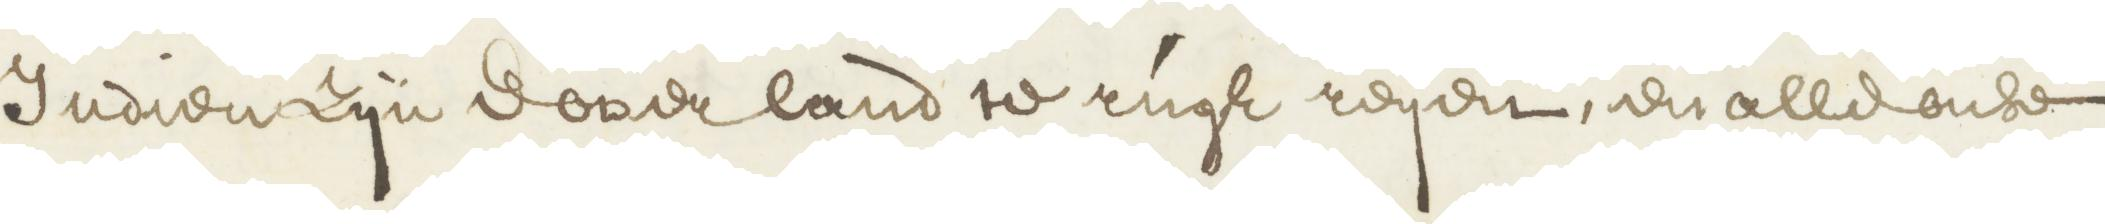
Indien zijn E:'over land te rugh reijen, en alle onse
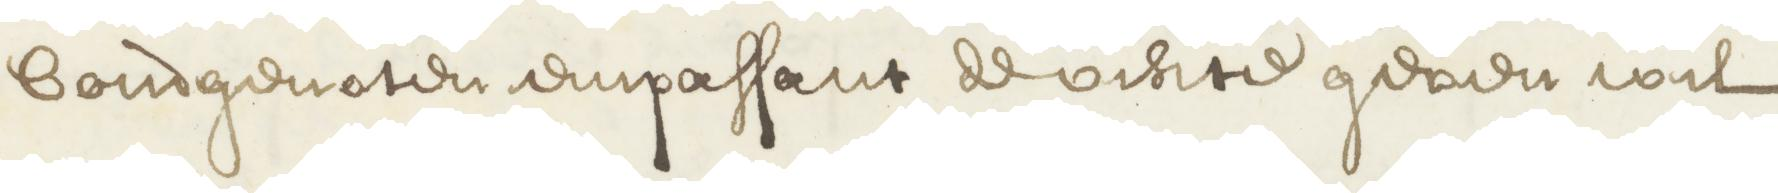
bondgenoten empassant de visite geven wil
